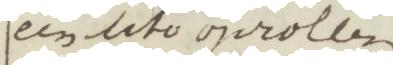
een dito oprollen
